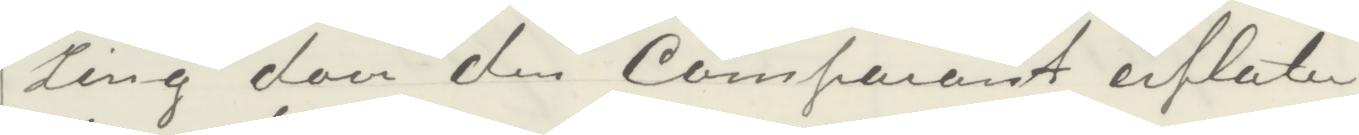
zing door den Comparant erflater
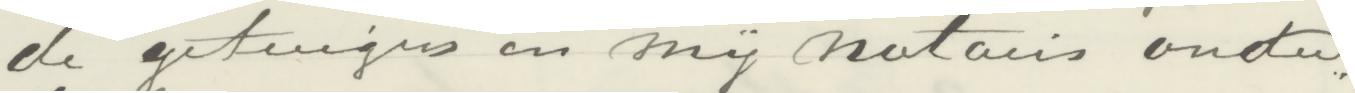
de getuigen en mij notaris onder„
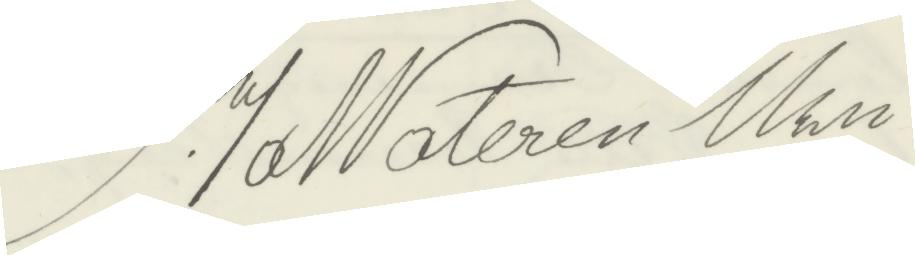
J. v/d Wateren Wzn
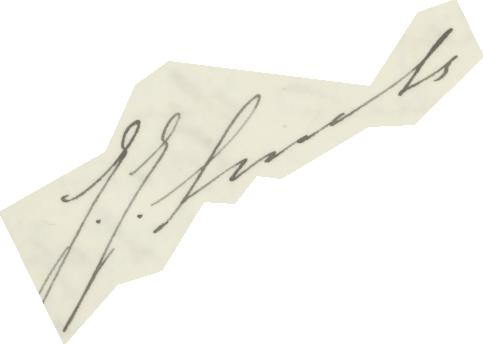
J.J.Smits
